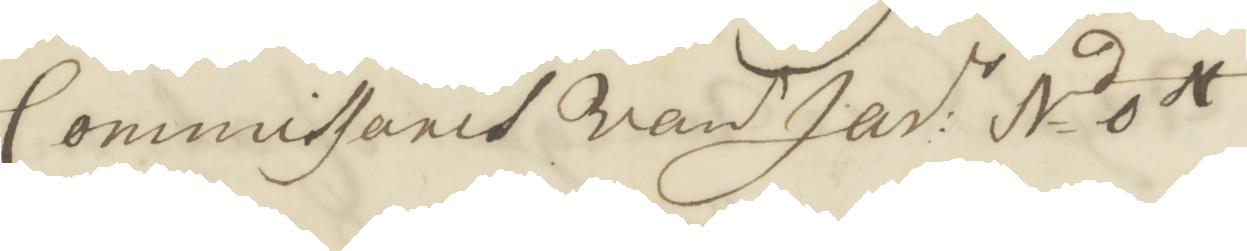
Commissaris van Jav:s N=d ost
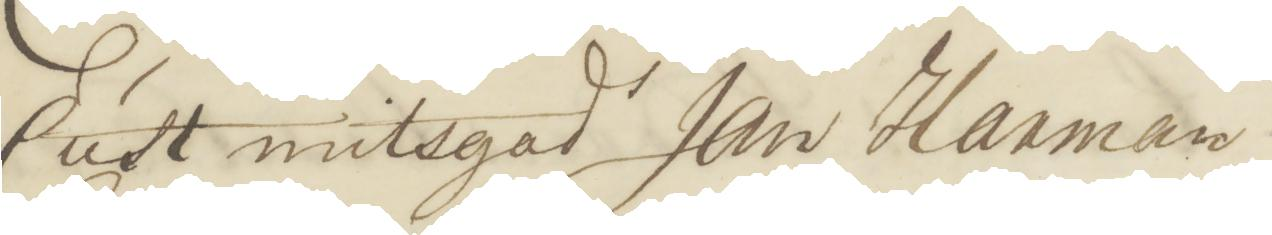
Cust mitsgads Jan Harman
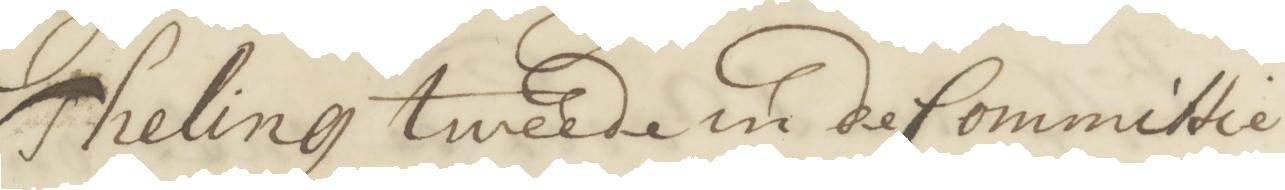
Theling tweede in de Commissie
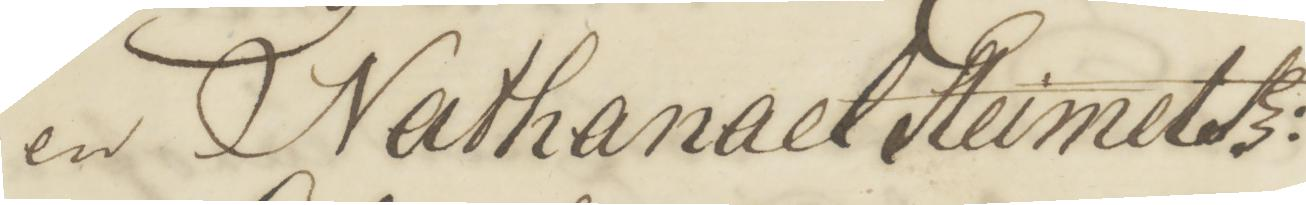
en Nathanael Steimetsz
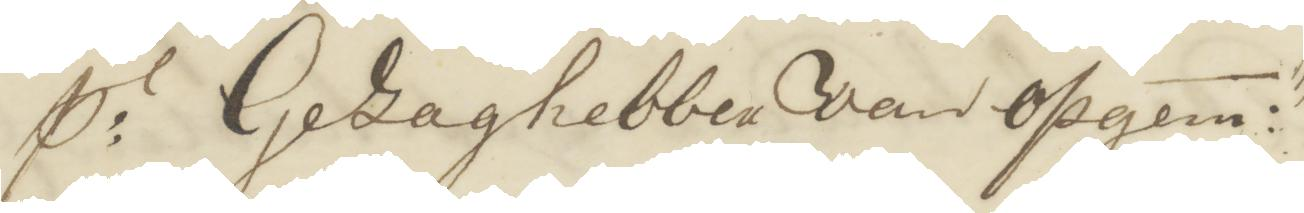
P:l Gezaghebber van opgem:
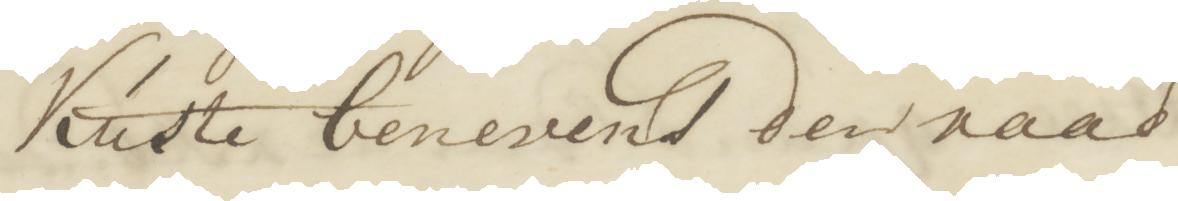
kuste benevens den raad
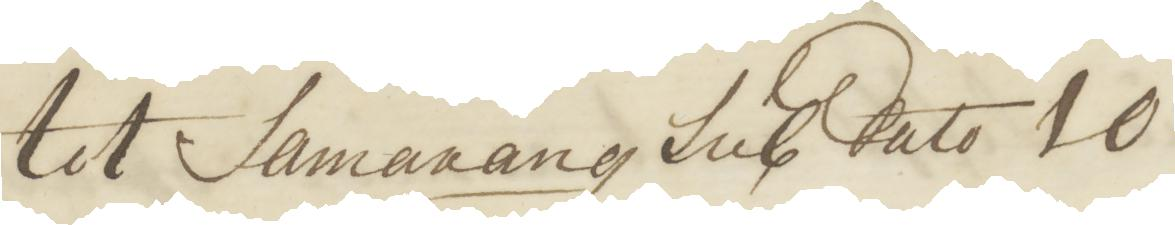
tot samarang sub dato 10
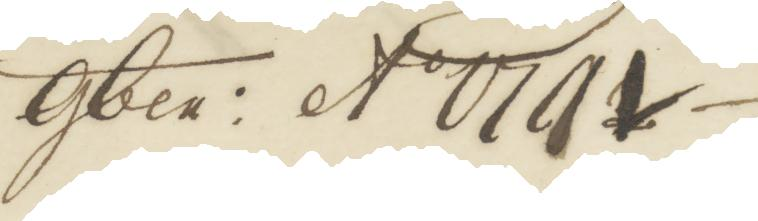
9ber: Ao 1741.
